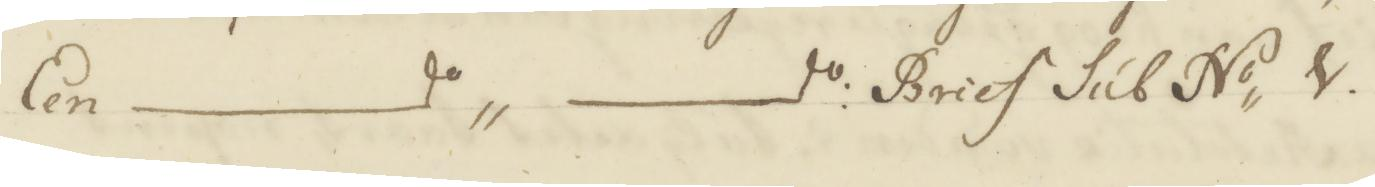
Een —:o „ —:o Brief sub N„o 1.
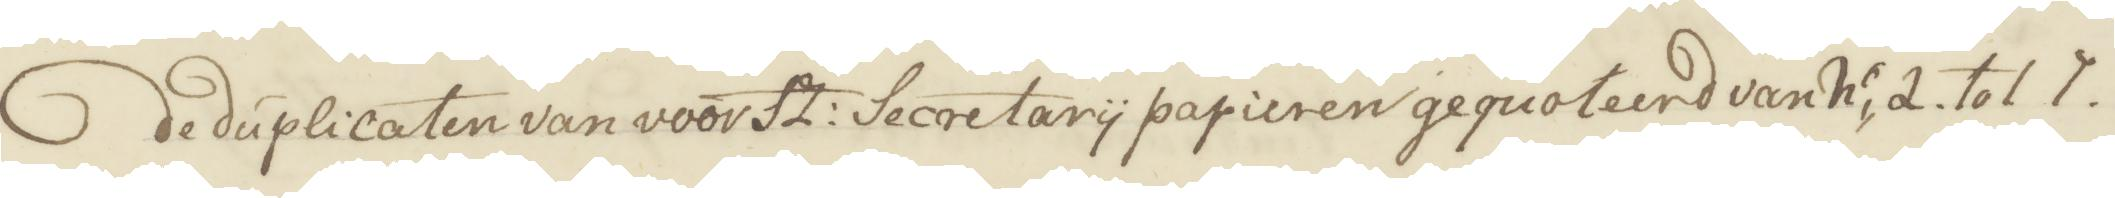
de duplicaten van voorsz: Secretarij papieren gequoteerd van N„o 2. tot 7.
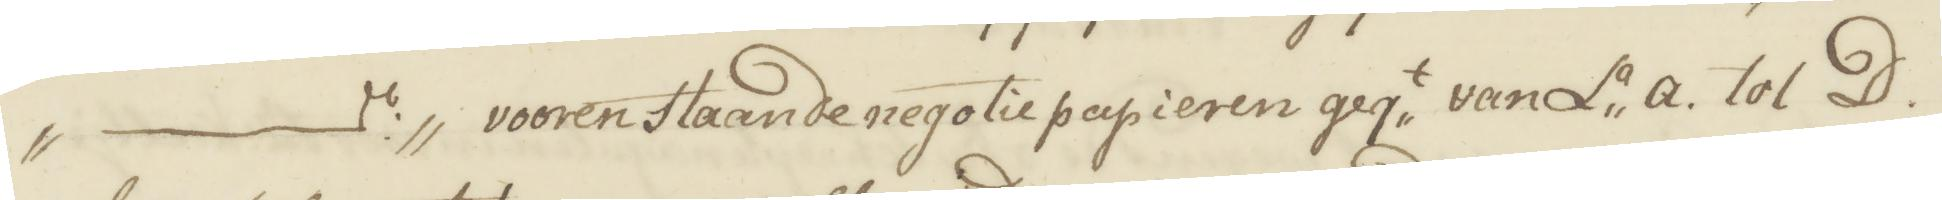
„ —:o „ vooren staande negotie papieren geq„t van L„a a. tot D.
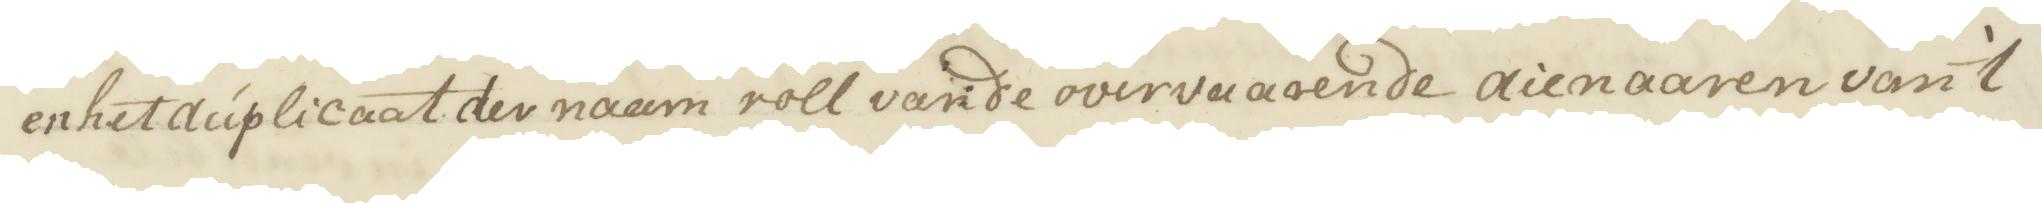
en het duplicaat der naam roll van de overvaarende dienaaren van ’t
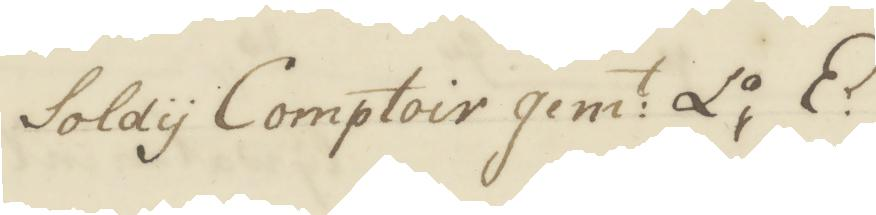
Soldij Comptoir gem:t L„a E:
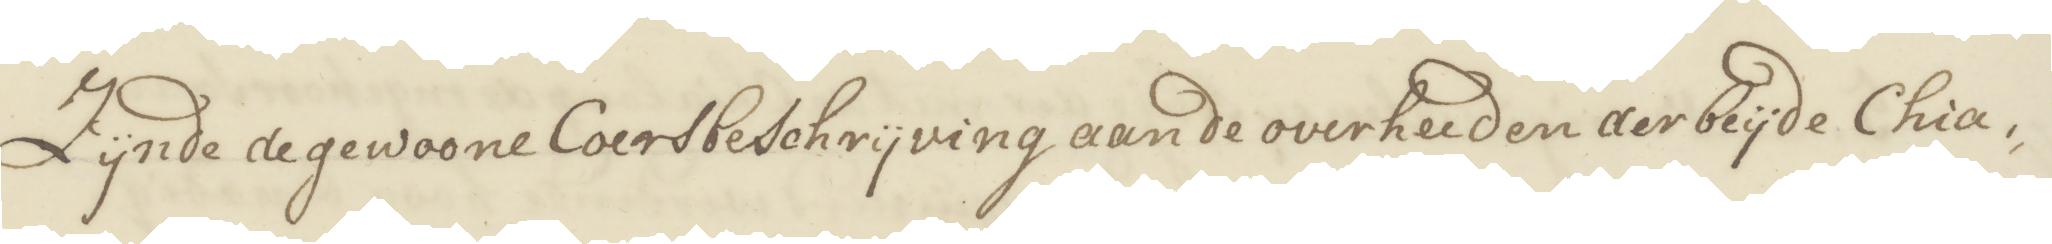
Zijnde de gewoone Coersbeschrijving aan de overheeden der beijde Chia„
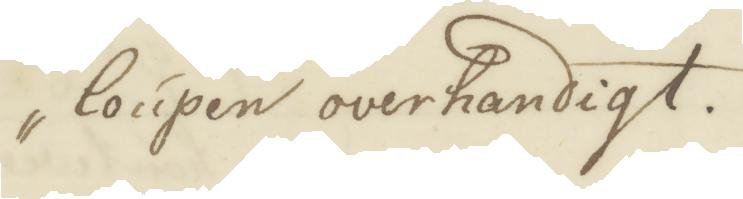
„loupen overhandigt.
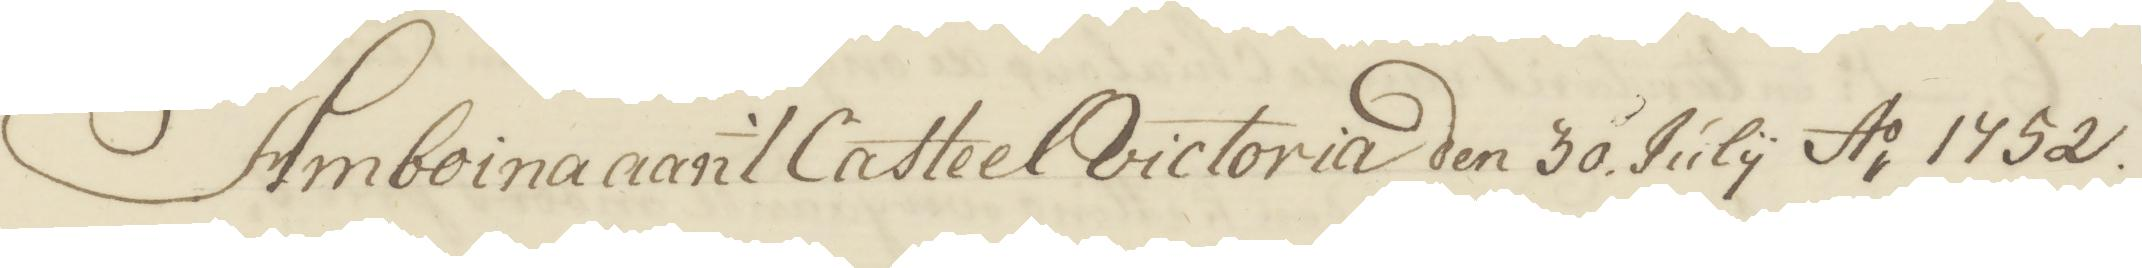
Amboina aan 't Casteel Victoria den 30.e Julij A„o 1752.
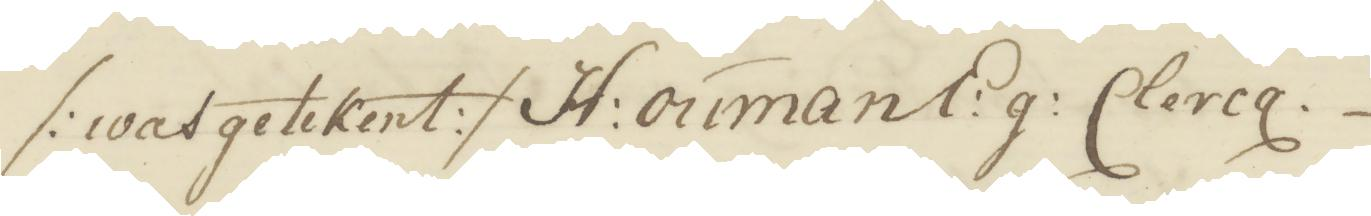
/:was getekent:/ H: ouman E: g: Clercq.-
